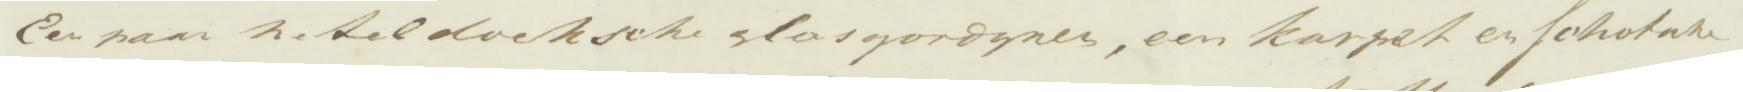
Een paar neteldoeksche glasgordynen, een karpet en schotsche
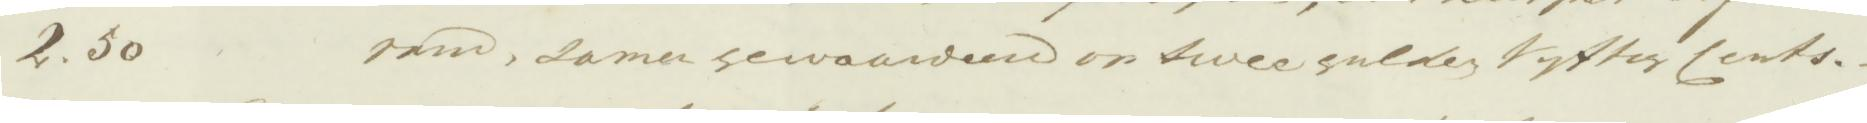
2. 50 rand, zamen gewaardeerd op twee gulden Vyftig Cents.
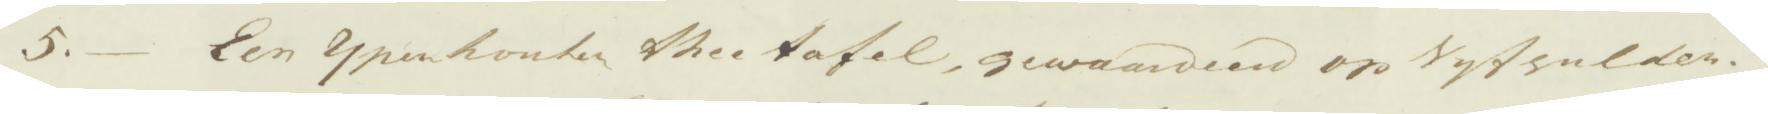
5. — Een Ypenhouten thee tafel, gewaardeerd op Vyf gulden.
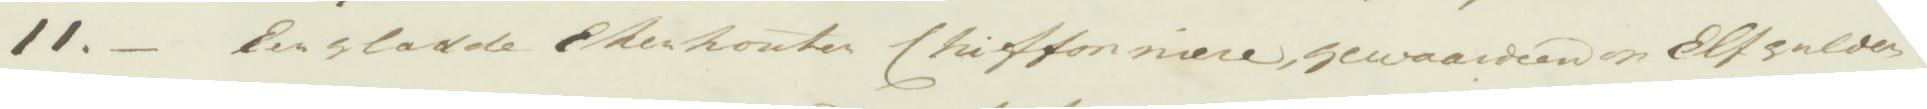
11. — Een gladde Ekenhouten Chiffonniere, gewaardeerd op Elf gulden
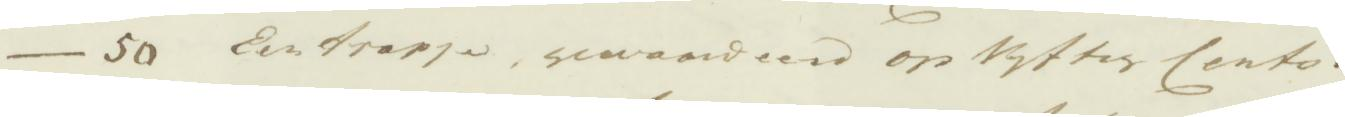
— 50 Een trapje, gewaardeerd op Vyftig Cents
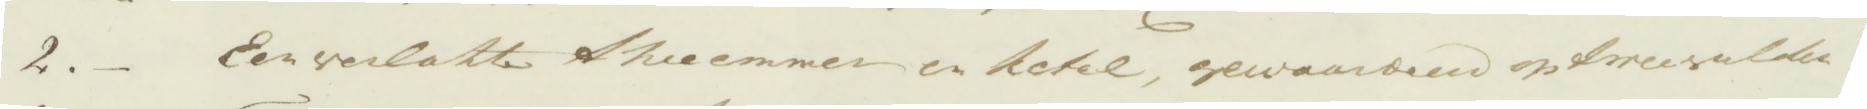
2. — Een verlakte theeemmer en ketel, gewaardeerd op twee gulden
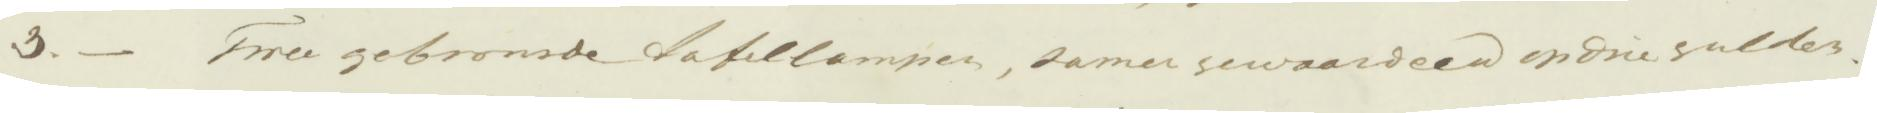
3. — Twee gebronsde tafellampen, zamen gewaardeerd op drie gulden.
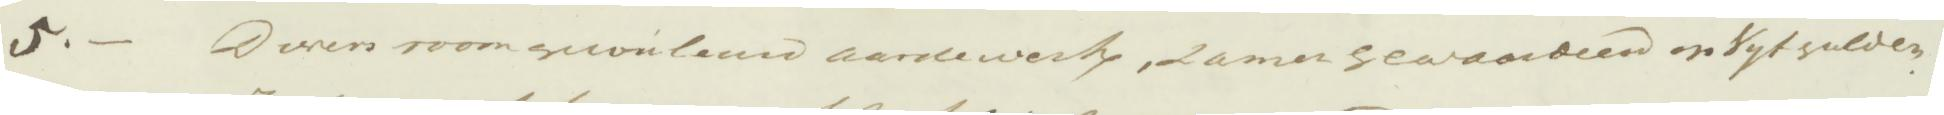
5. — Divers room gecouleurd aardewerk, zamen gewaardeerd op Vyf gulden.
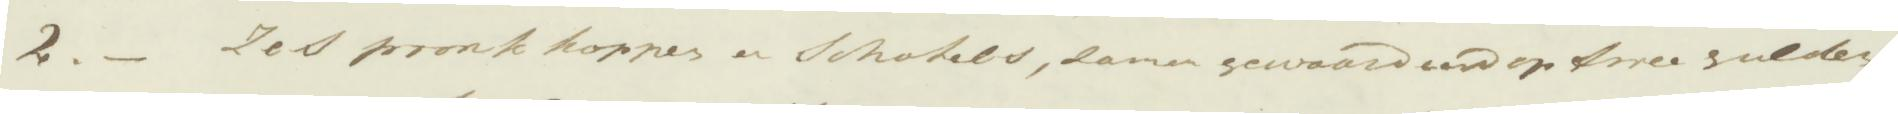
2. — Zes pronk koppen en schotels, zamen gewaardeerd op twee gulden
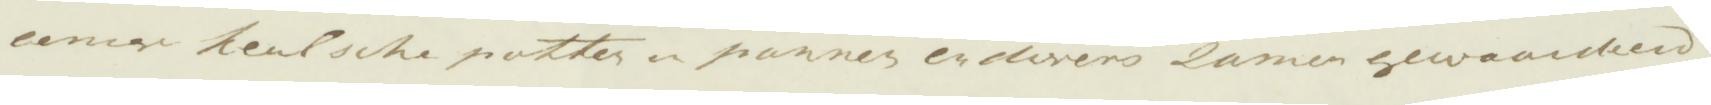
eenige keulsche potten en pannen en divers zamen gewaardeerd
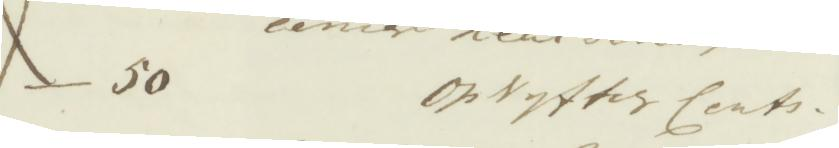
— 50 op vyftig Cents.
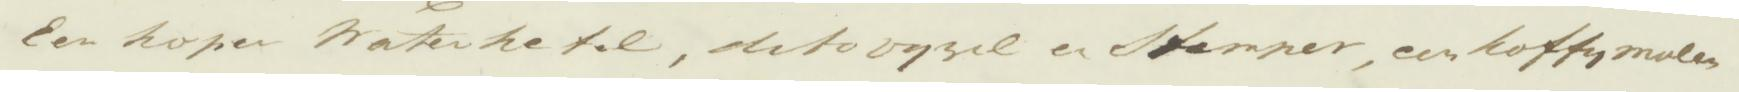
Een koper Waterketel, dito vyzel en stamper, een koffymolen
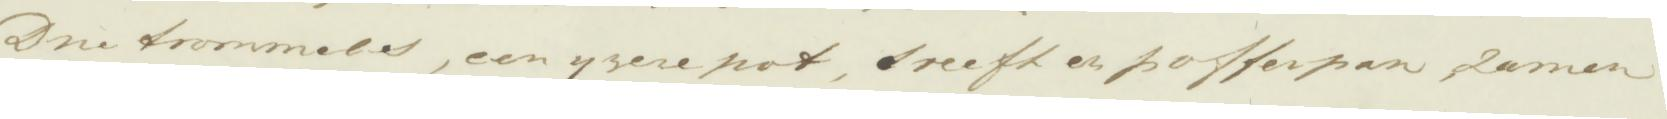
Drie trommels, een yzerepot, treeft en pofferpan, zamen
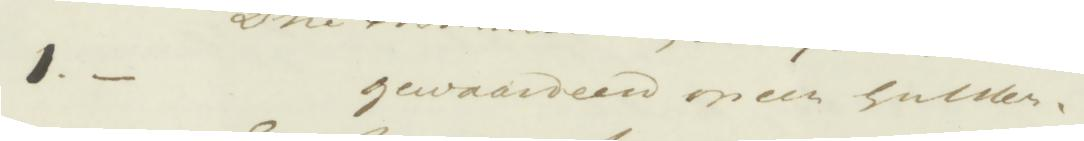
1. — gewaardeerd op een Gulden.
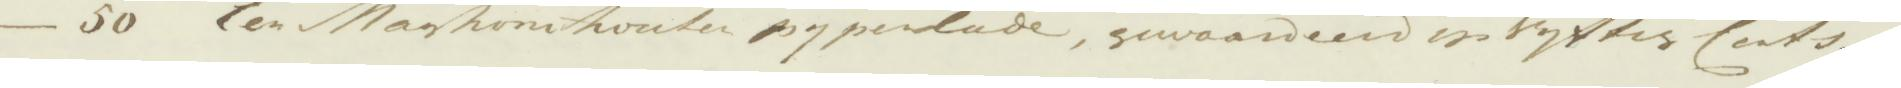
— 50 Een Maghonihouten pypenlade, gewaardeerd op vyftig Cents.
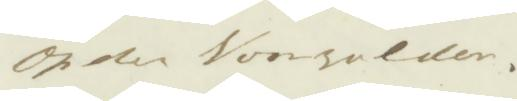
op den Voorzolder
